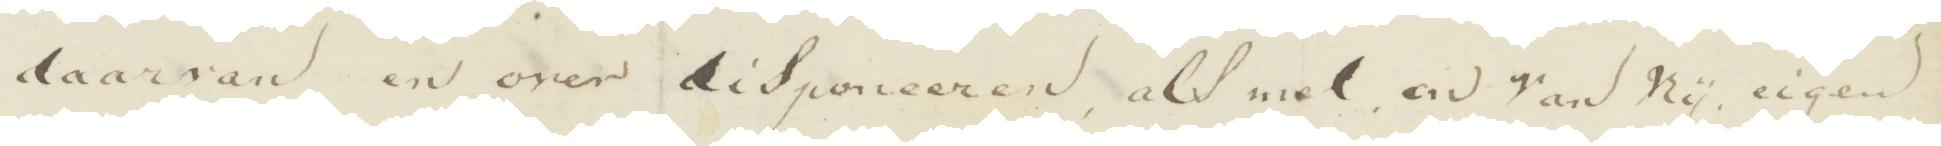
daarvan en over disponeeren, als met, en van vrij eigen
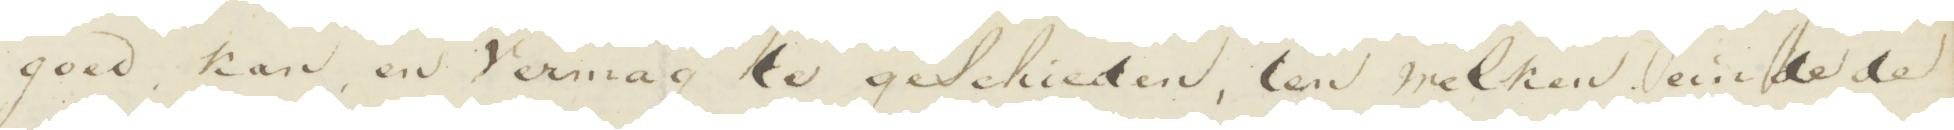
goed, kan, en Vermag te geschieden, ten welken einde de
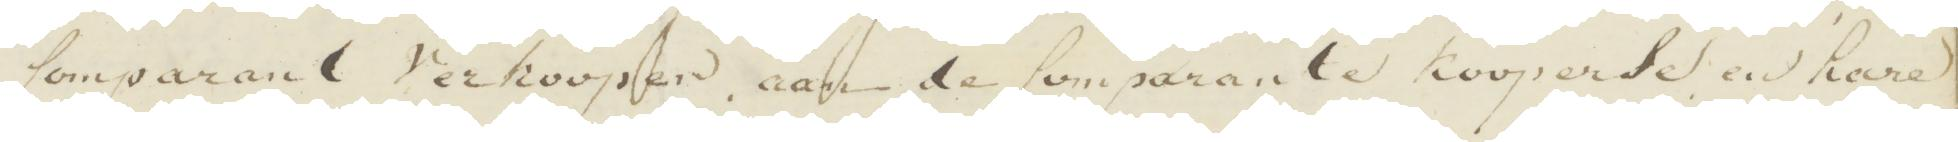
Comparant Verkooper, aan de Comparante kooperse en hare
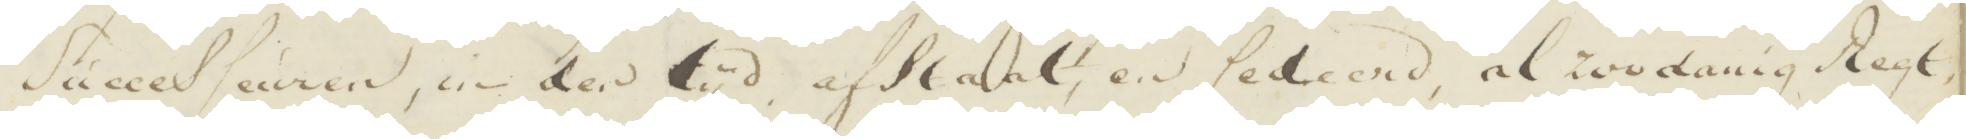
successeuren, in der tijd, afstaat, en Cedeerd, al zoodanig Regt,
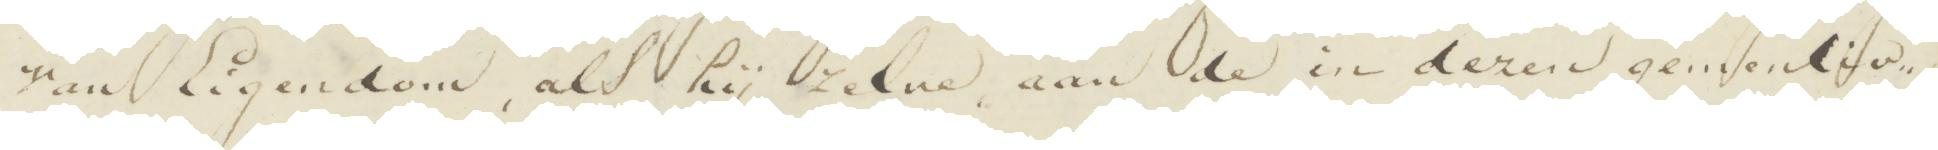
van Eigendom, als hij zelve, aan de in dezen gementio„
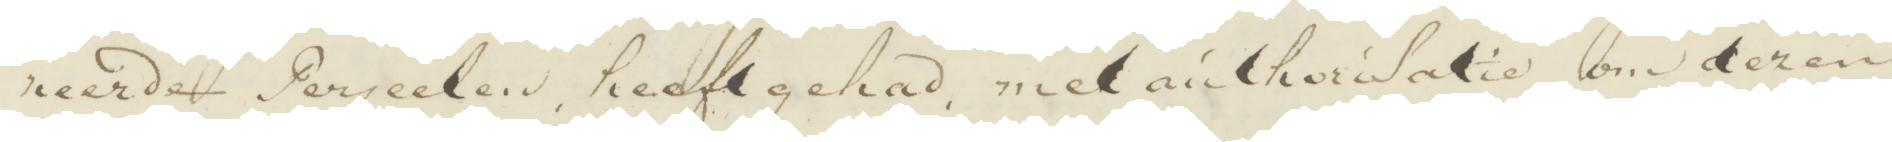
neerde Perceelen, heeft gehad, met authorisatie om dezen
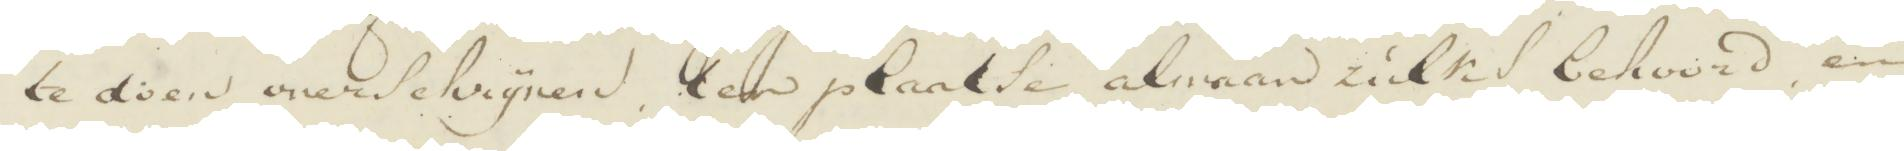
te doen overschrijven, ten plaatse alwaar zulks behoord, en
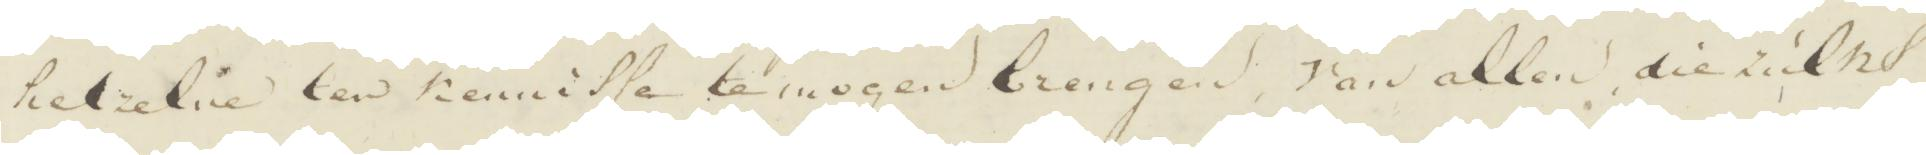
hetzelve ter kennisse te mogen brengen, van allen, die zulks
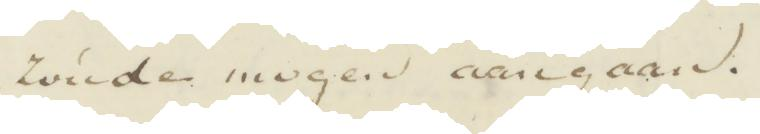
zoude mogen aangaan.
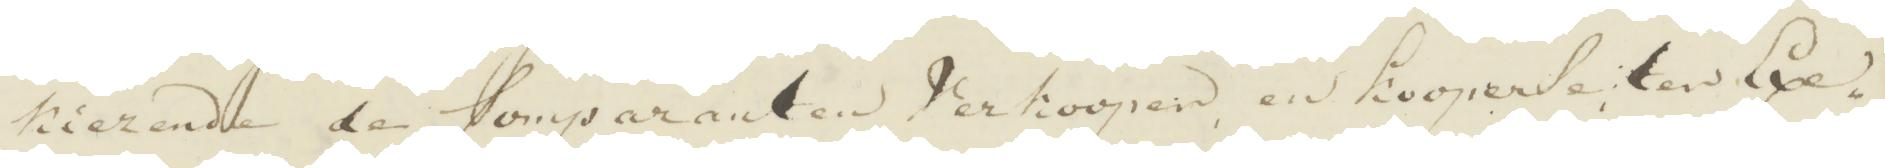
kiezende de Comparanten Verkooper, en kooperse, ten Exe„
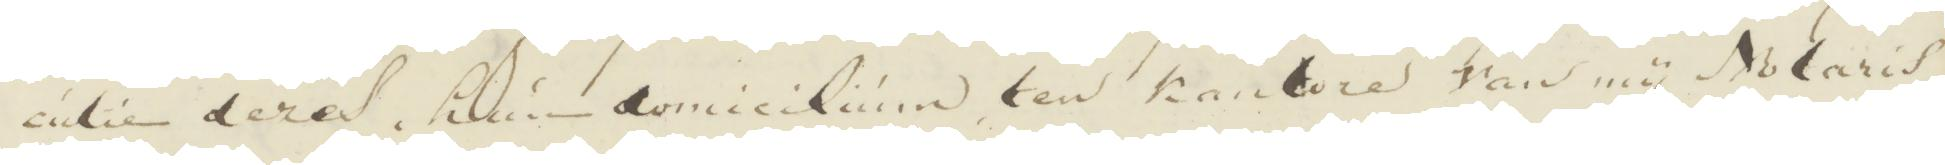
cutie dezes, hun domicilium, ten kantore van mij Notaris
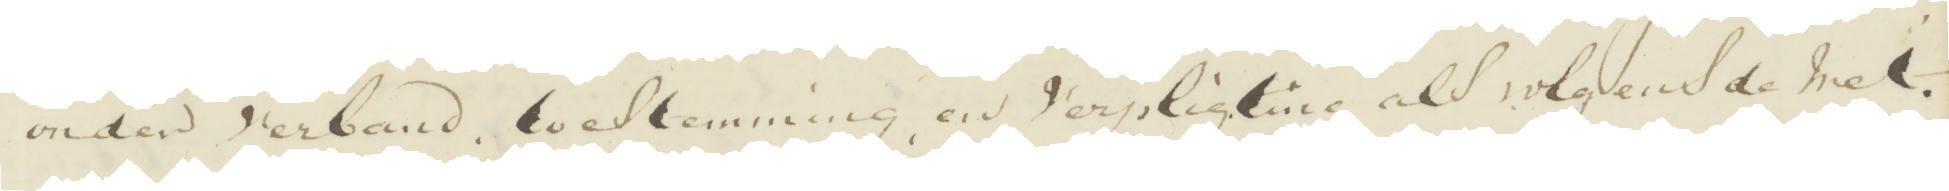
onder verband, toestemming, en Verpligting als volgens de wet.
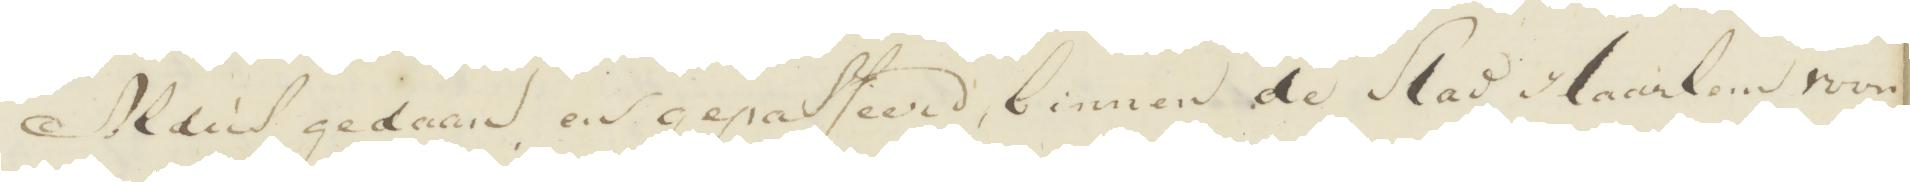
Aldus gedaan, en gepasseerd, binnen de stad Haarlem voor
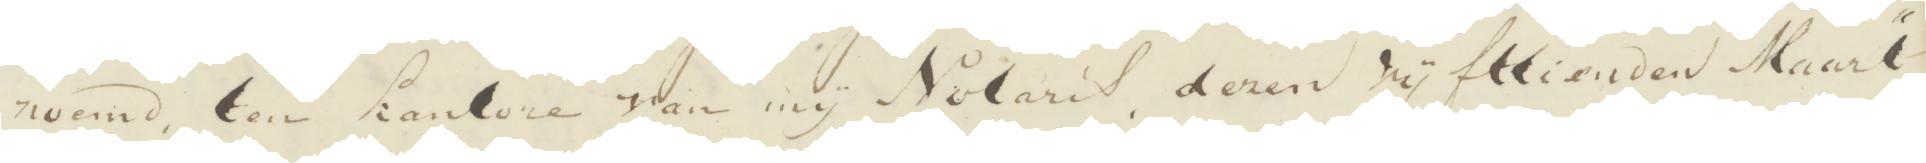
noemd, ten kantore van mij Notaris, dezen vijfttienden Maart
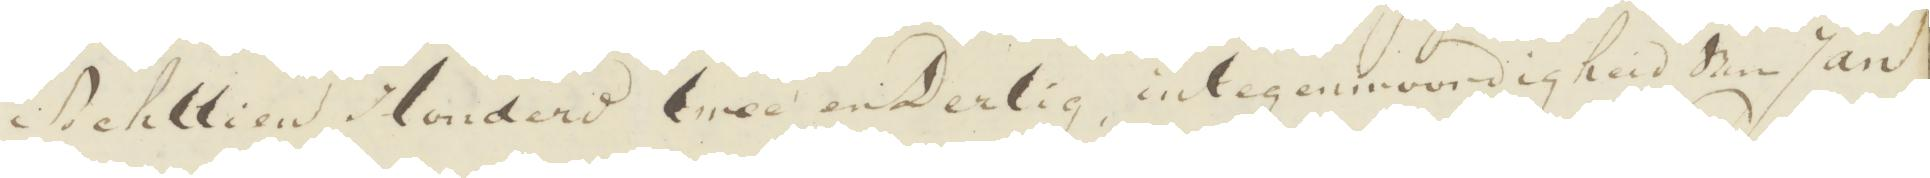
Achttien Honderd twee en Dertig, integenwoordigheid van Jan
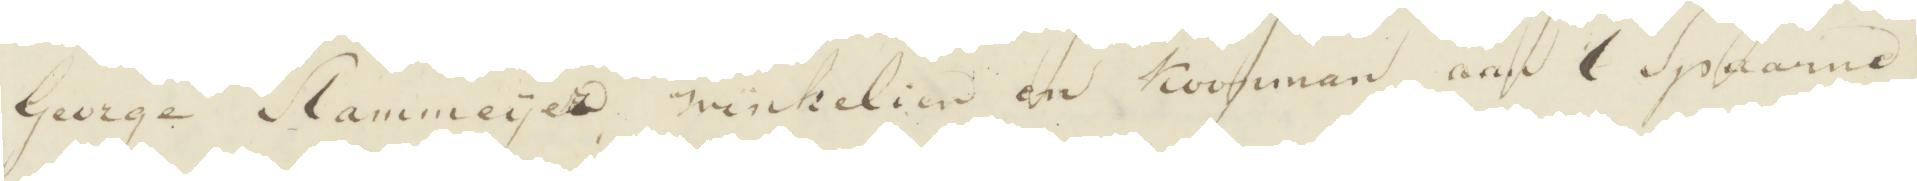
George Stammeijer, winkelier, en koopman aan ’t Spaarne
